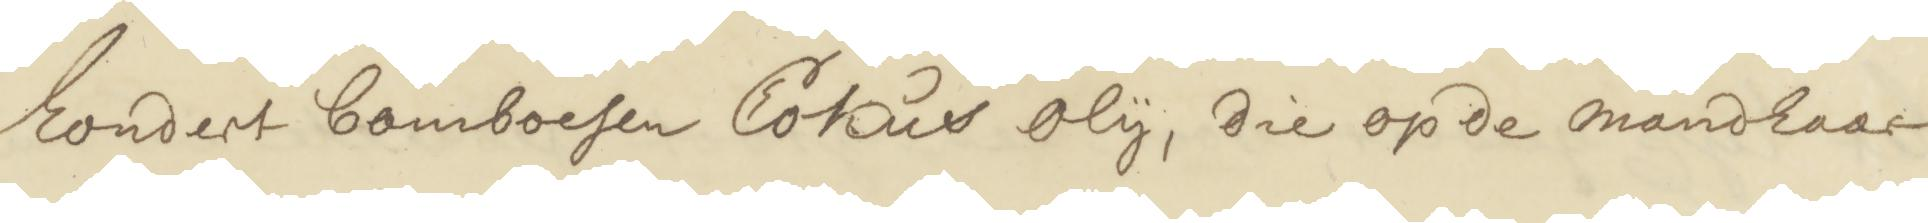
hondert bomboesen Cokus olij, die op de mandhaar
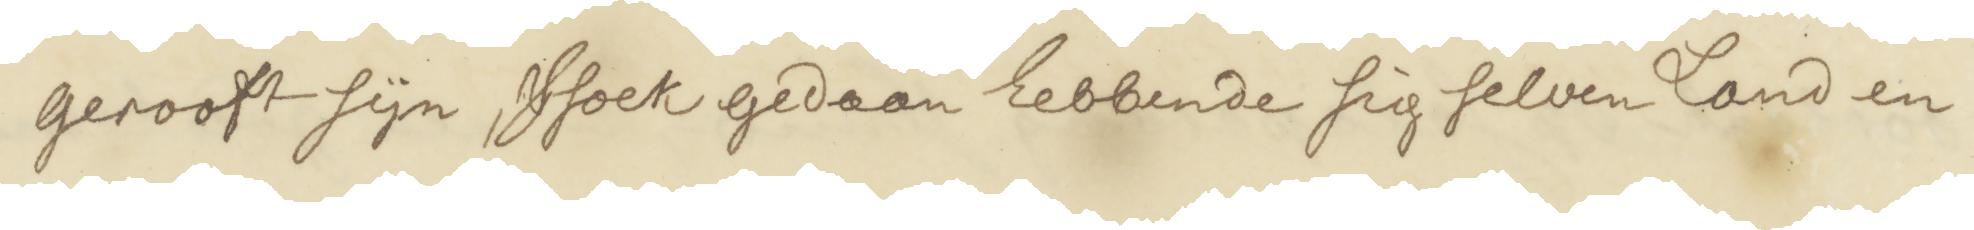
gerooft sijn, versoek gedaan hebbende sig selven land en
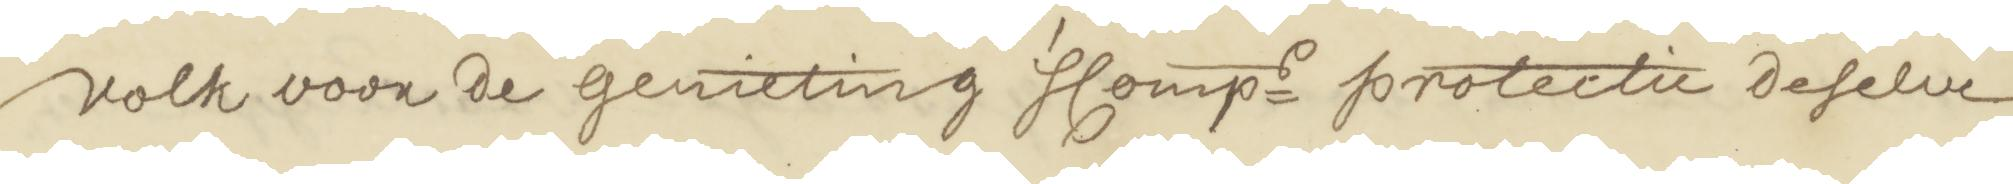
volk voor de genieting ’sComp=s protectie deselve
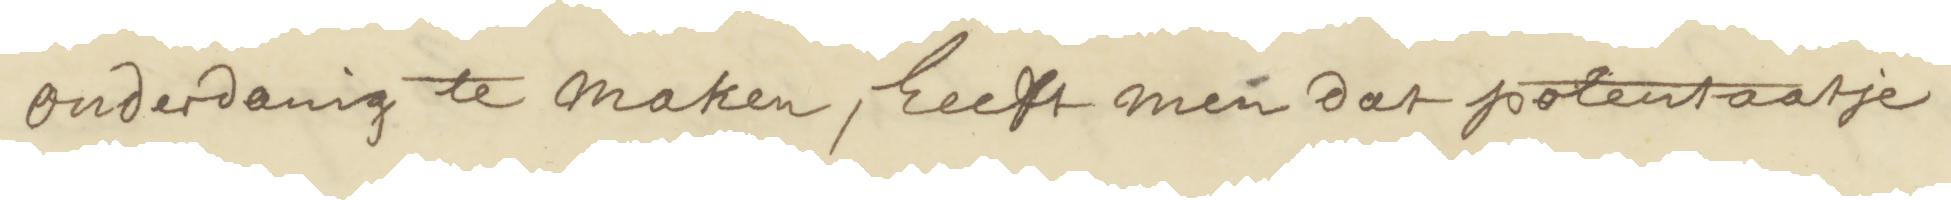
onderdanig te maken, heeft men dat potentaatje
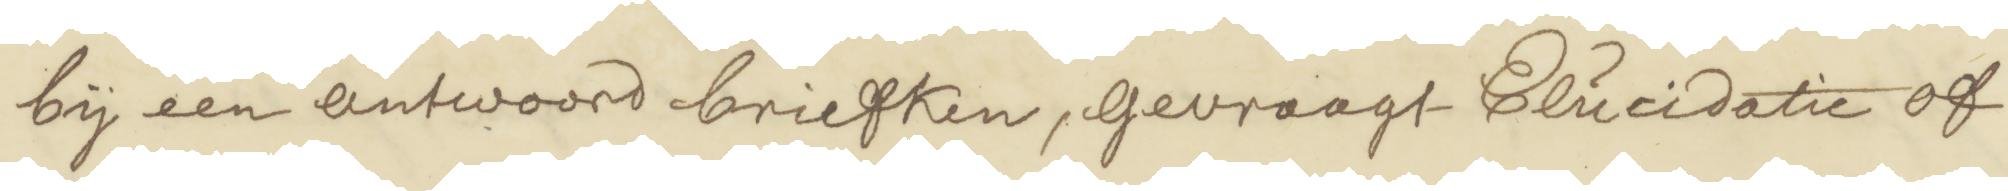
bij een antwoord briefken, gevraagt Elucidatie of
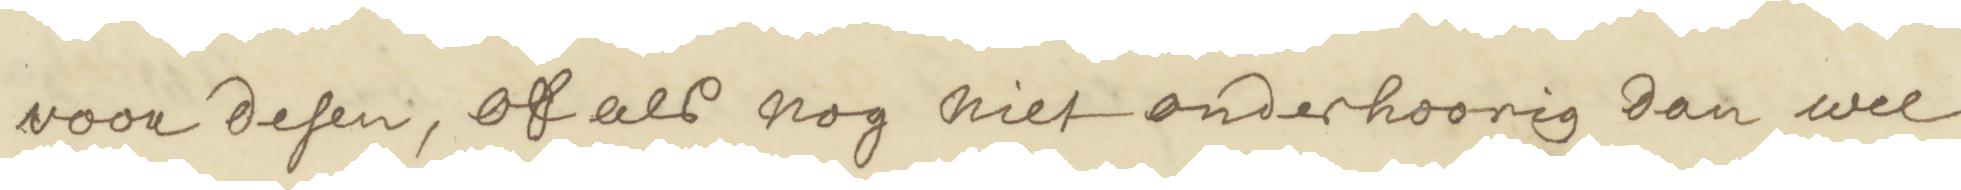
voor desen, of als nog niet onderhoorig dan wel
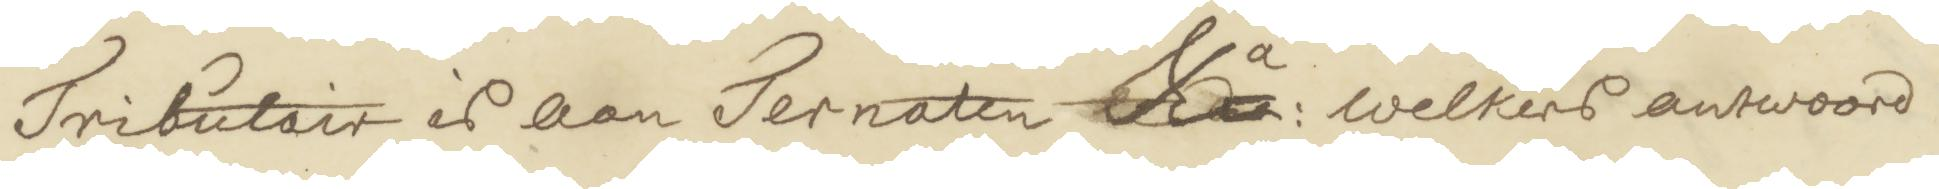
Tributair is aan Ternaten &=a: welkers antwoord
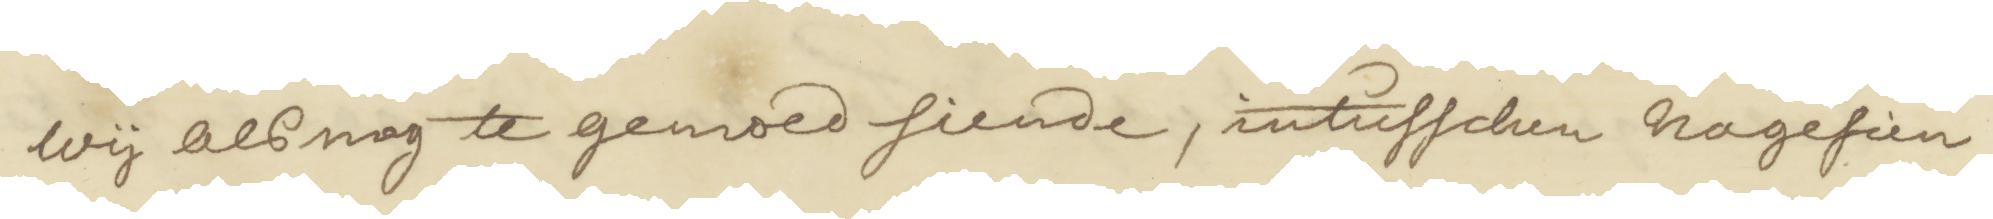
wij als nog te gemoed siende, intusschen nagesien
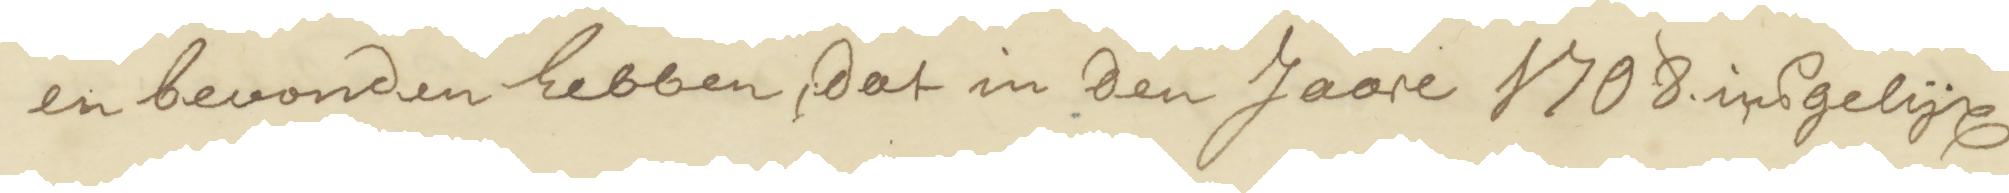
en bevonden hebben, dat in den Jaare 1708. insgelijx
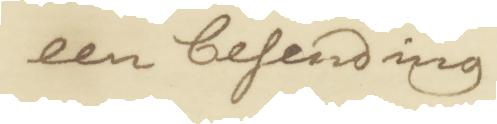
een besending
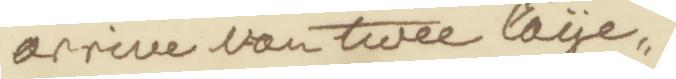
arrive van twee Caije„
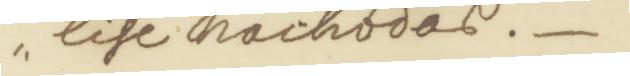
„lise nachodas. —
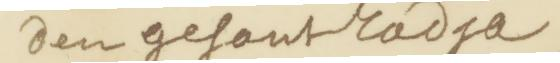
den gesant radja
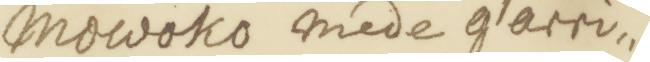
mowoko mede g'arri„
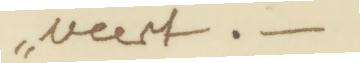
„veert. —
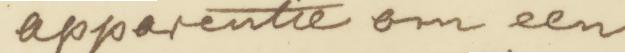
apparentie om een
